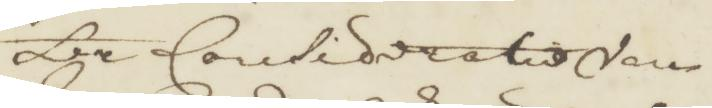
ter consideratie van
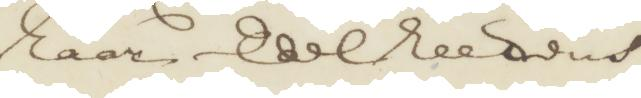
haar Edelheedens
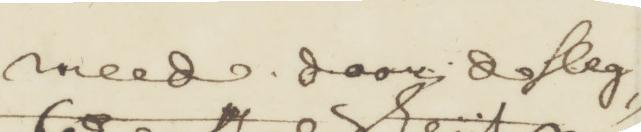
meede. door desleg„
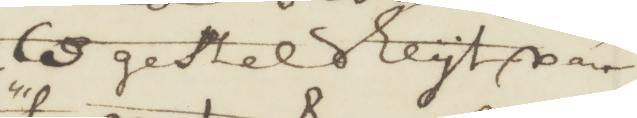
te gesteldheijt van
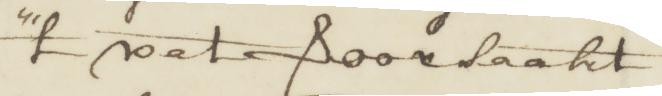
’t vat veroorsaakt
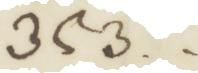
353. -
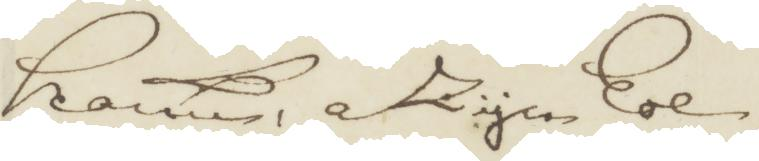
kann: azijen hol
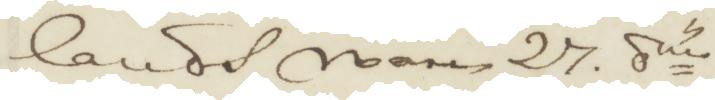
lands ware 27. d=m
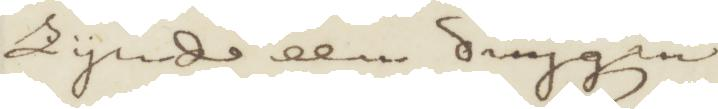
zijnde een duijg in
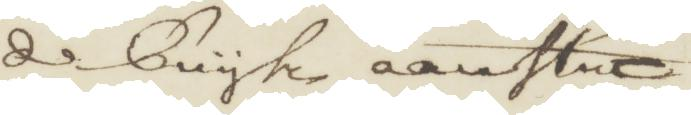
de buijk aanstuc
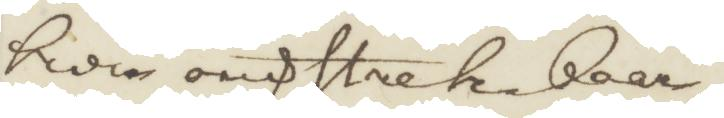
ken onverstrekbaar
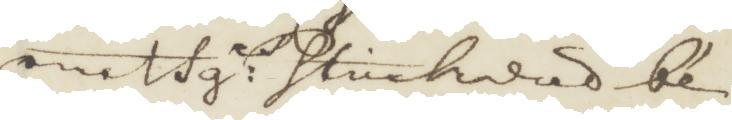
mitsg:rs stinkend be
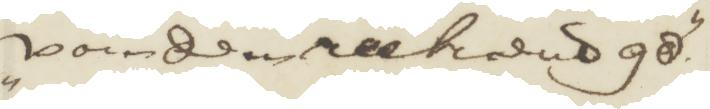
„vonden reekend 98.
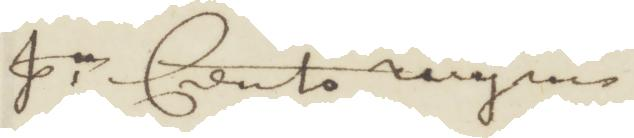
p,r Cento ruijm
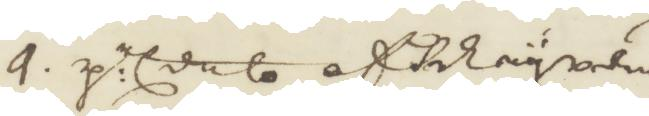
4. p:r Cento afschrijven
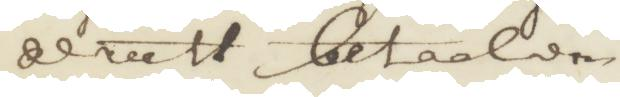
de reest betaalen
